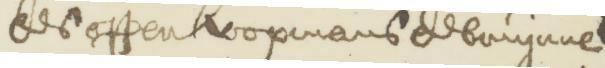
des opperkoopmans de bruijnne
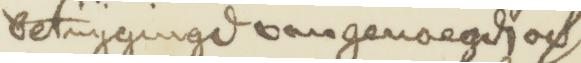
betuijginge van genoegen over
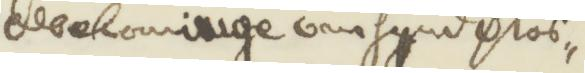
de bekominge van sijne verlos„
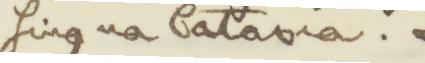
sing na batavia.
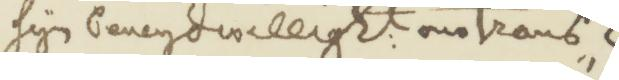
sijn bereijdwilligh:t ons trans„
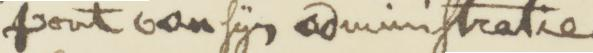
port van sijn administratie
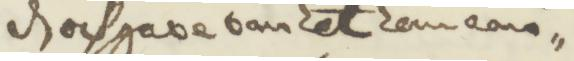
en overgave van het hem aan,
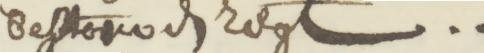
bestorven regt.
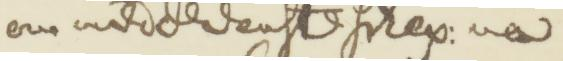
om med de eerste schep: na
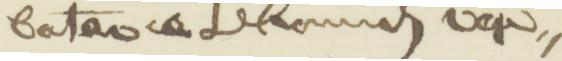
batavia te konnen ver„
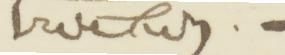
trecken.
